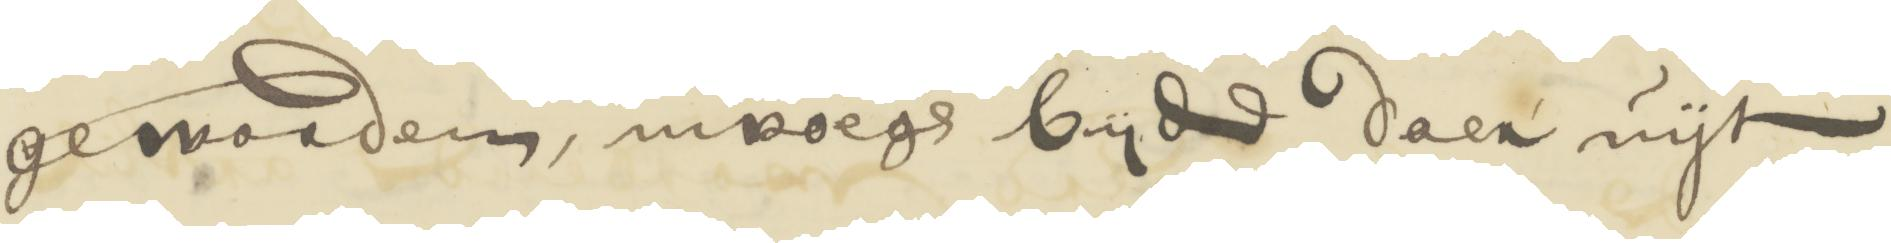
geworden, invoege bij de daer uijt
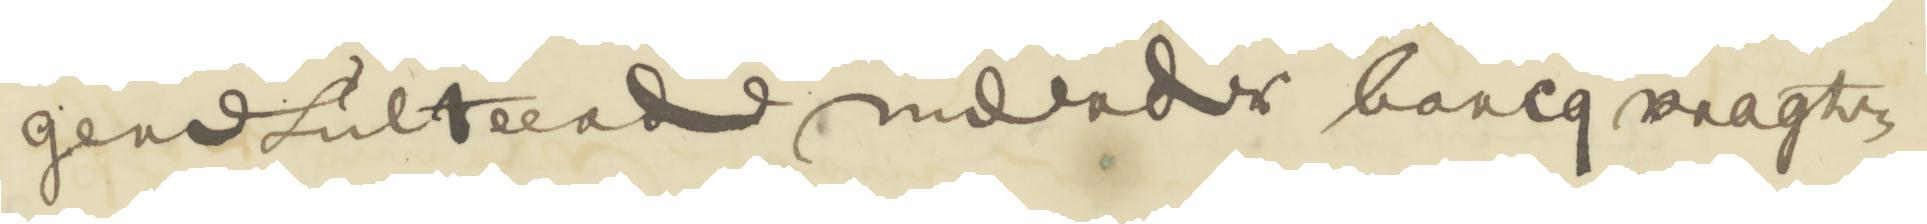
geresulteerde meerder barcq vragten
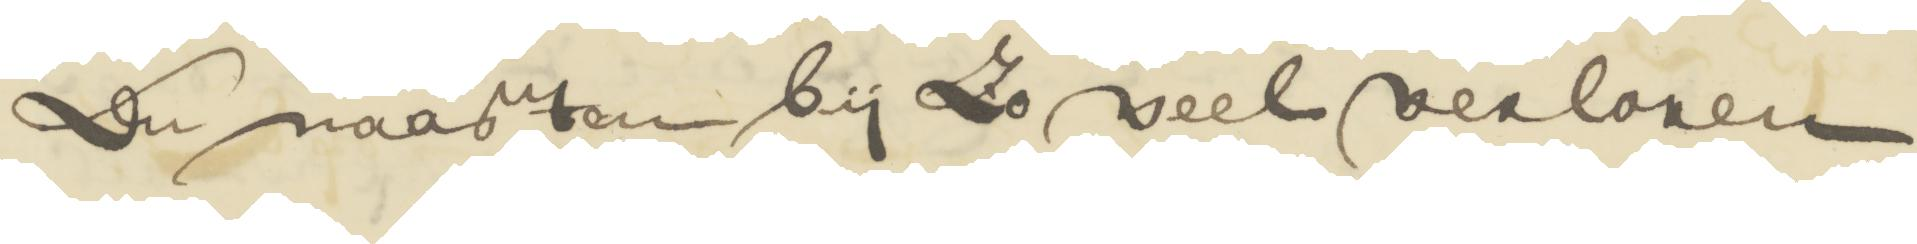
ten naasten bij Zo veel verloren
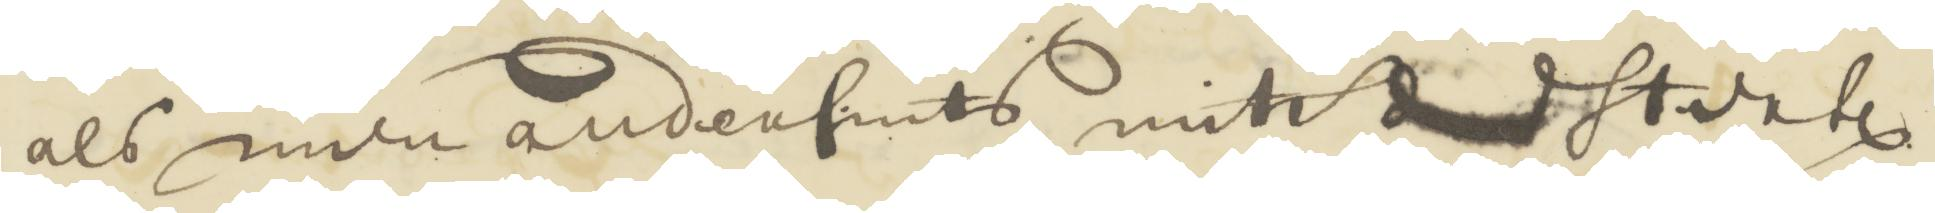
als men andersints mits de sterk
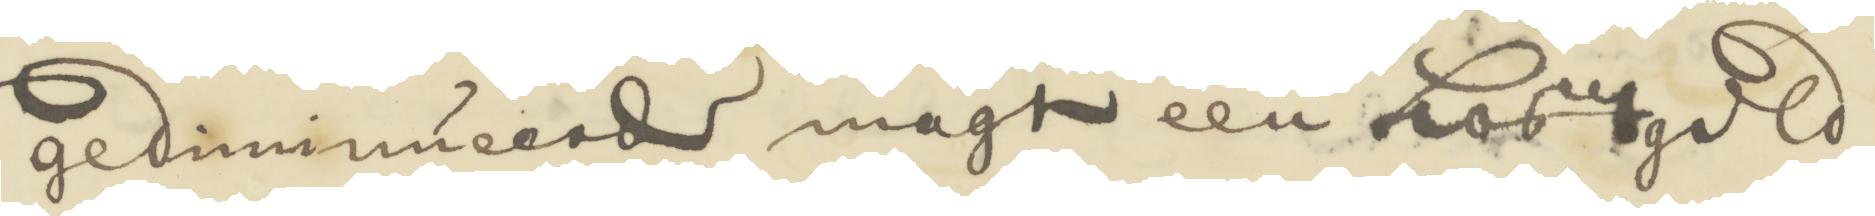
gediminueerde magt een kostgeld
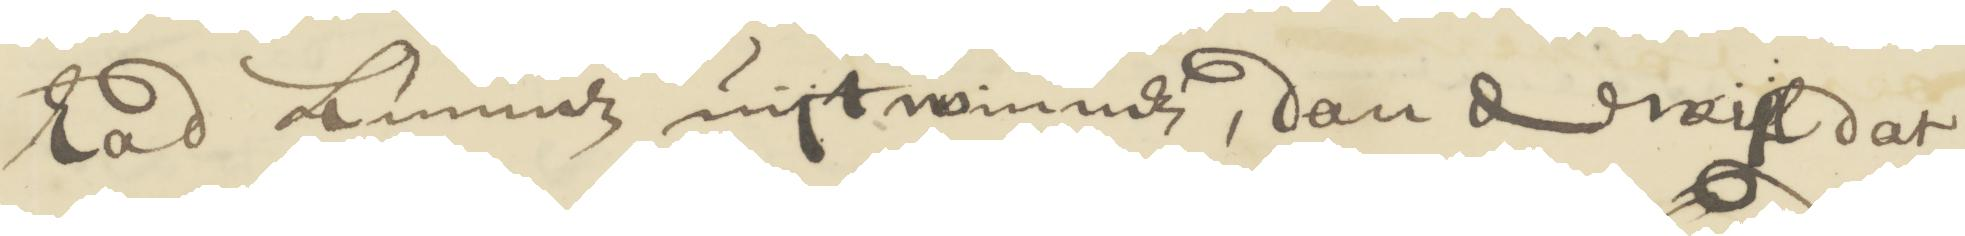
had kunnen uijtwinnen, dan dewijl dat
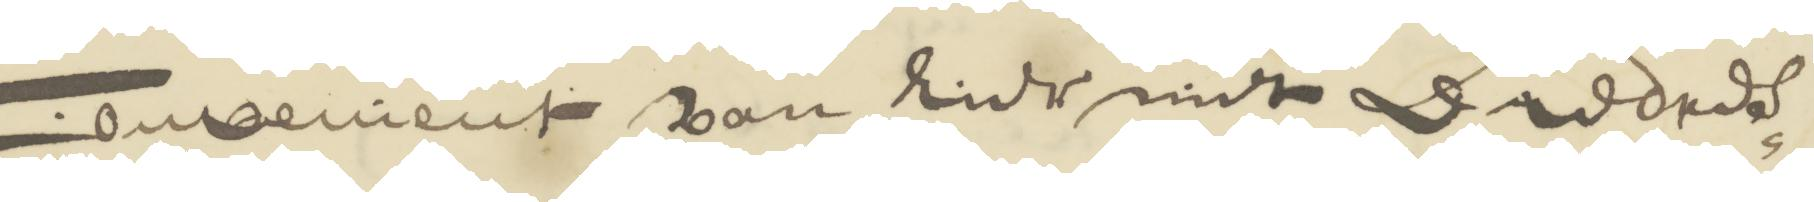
Couvenient van hier niet te redres
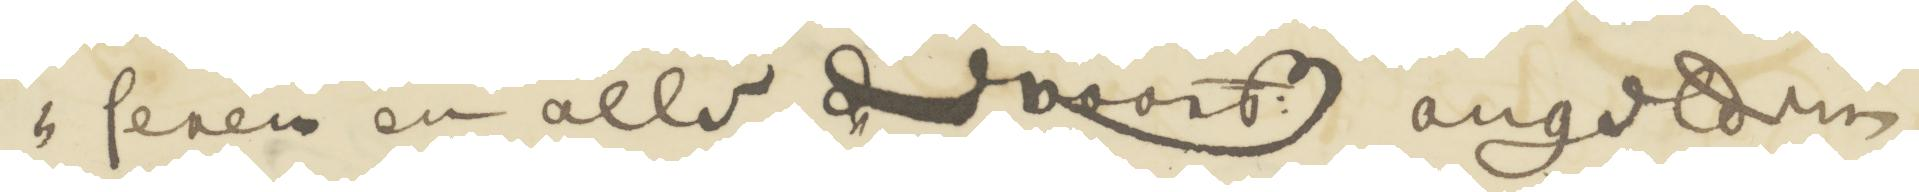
„seren en alle de voors: ongelden
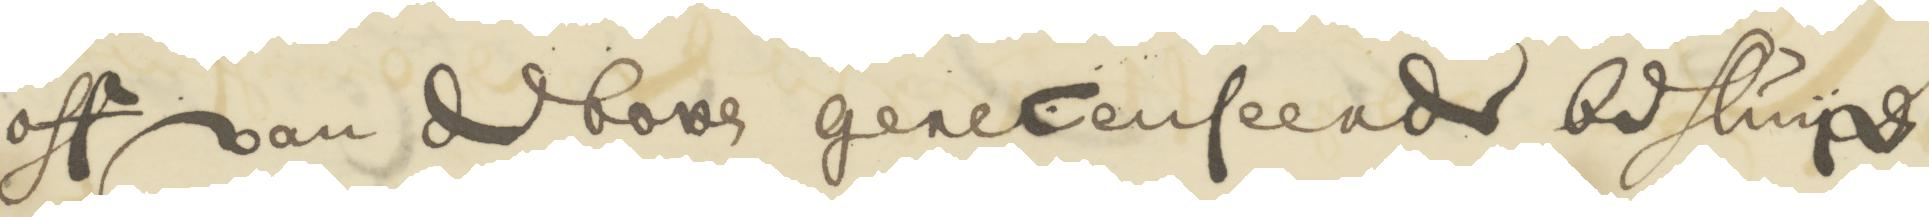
off van de boven gerecenseerde besluijte
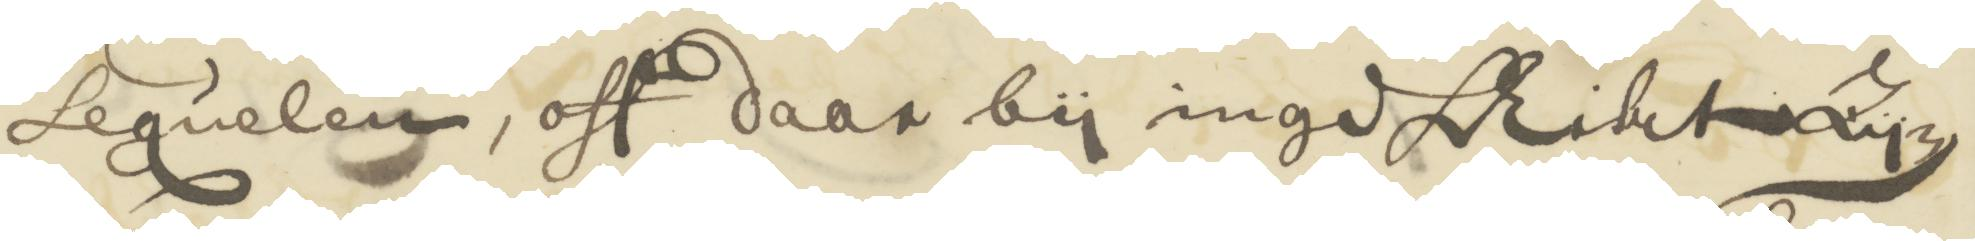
te quelen, off daarbij ingeschikt Zijn
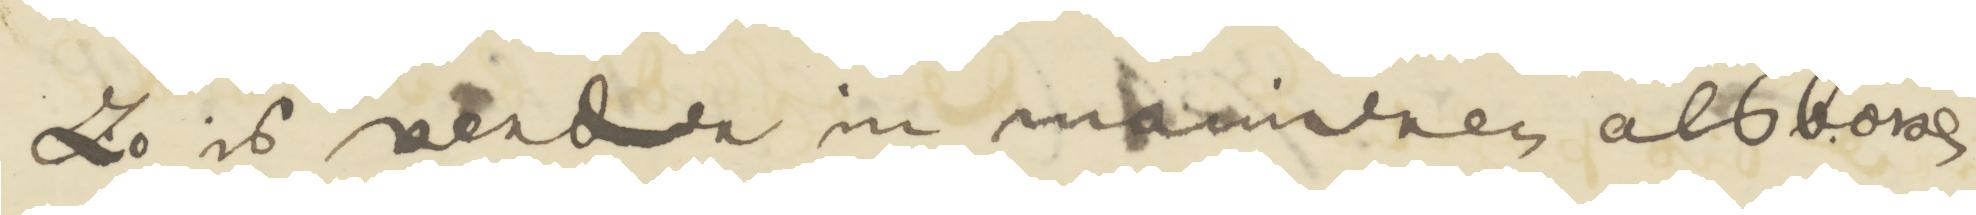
Zo is verder in manieren als boven
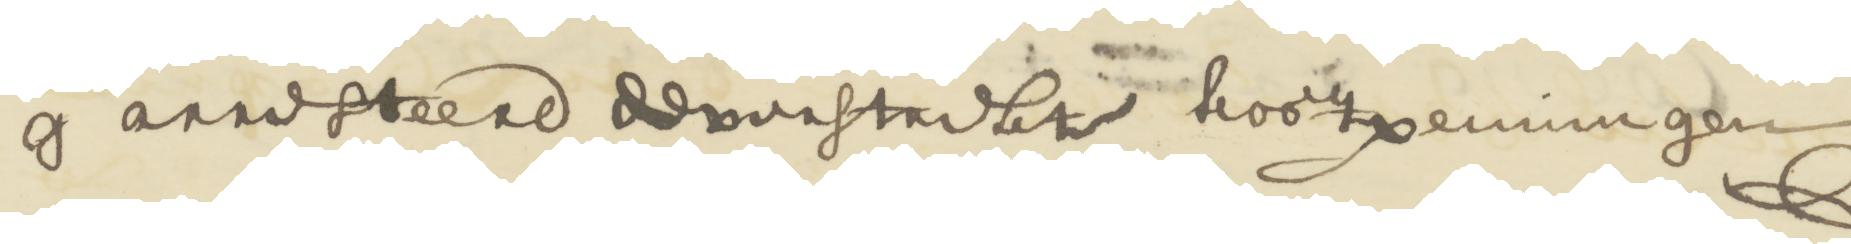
g’arresteerd de verstrekte kostpenningen
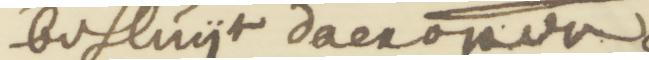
besluijt daerover
